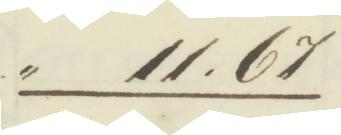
„ 11.67
